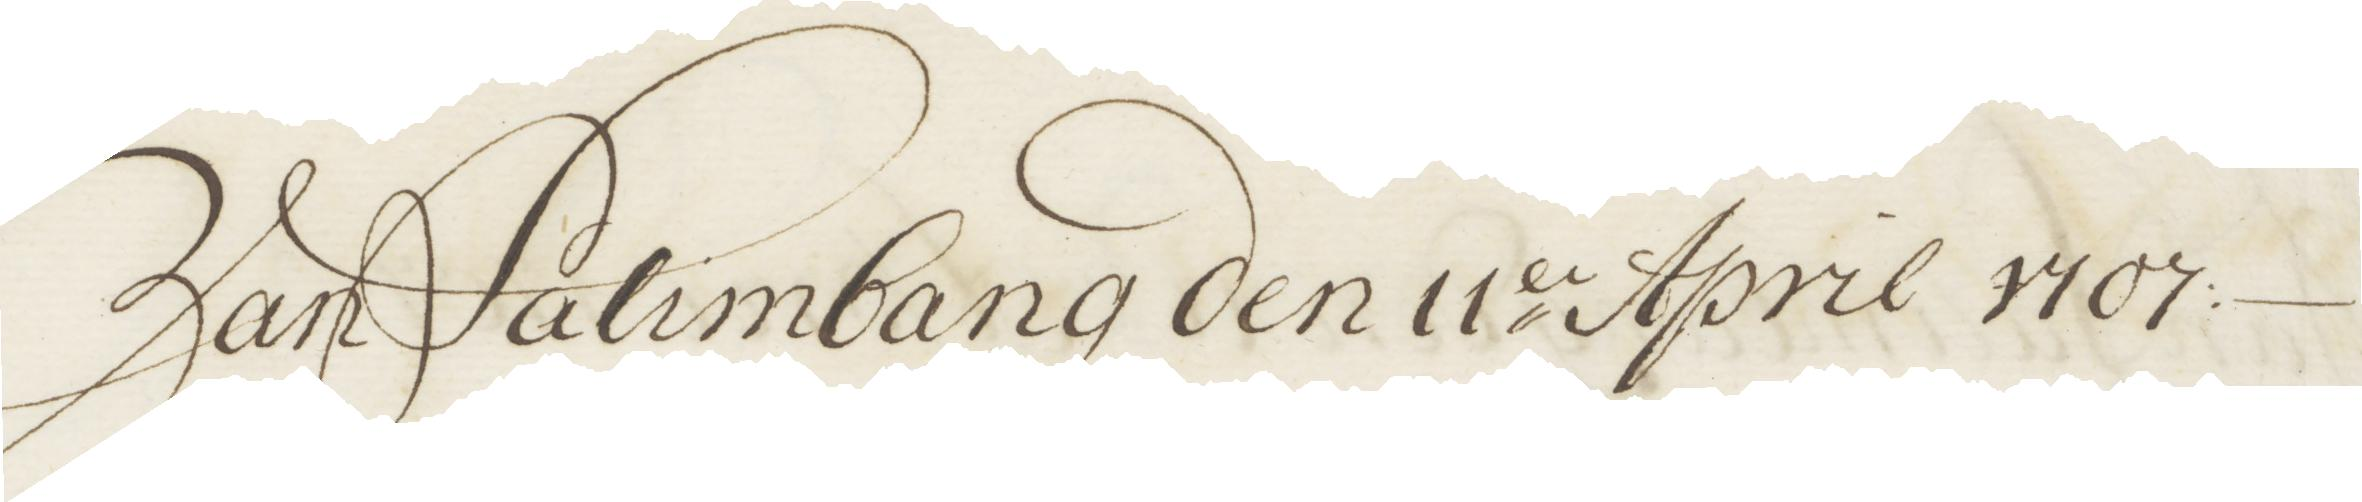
Van Palimbang den 11„en April 1707:—
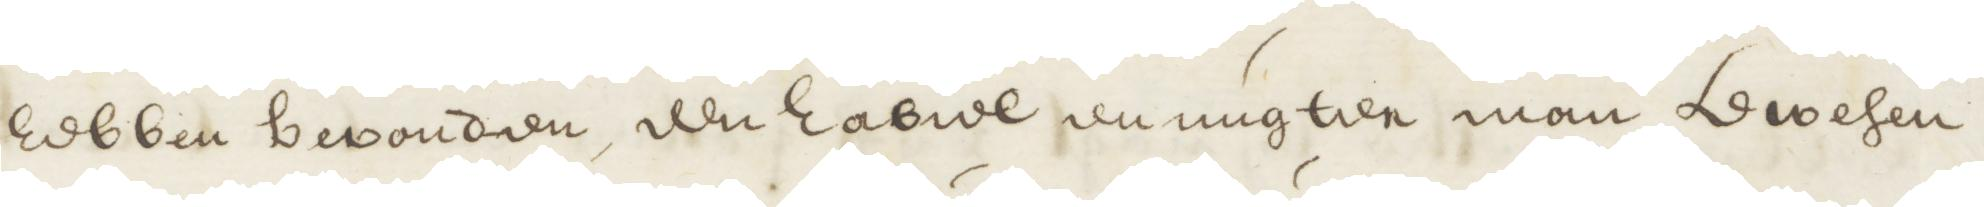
hebben bevonden, een habiel en nugter man te wesen
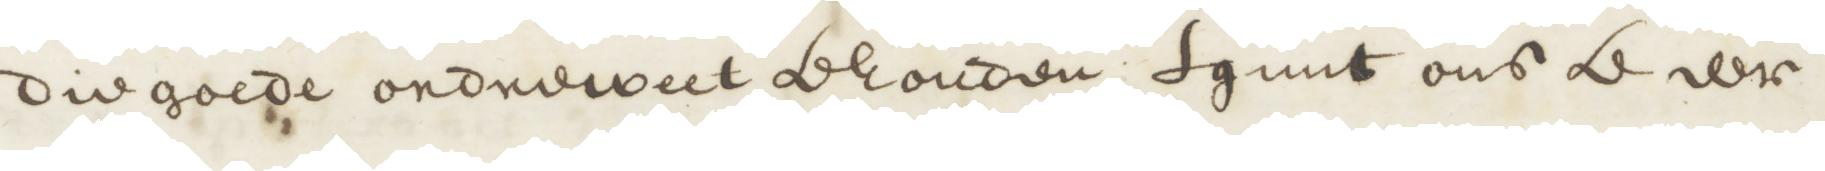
die goede ordreweet tehouden, 't gunt ons te eer
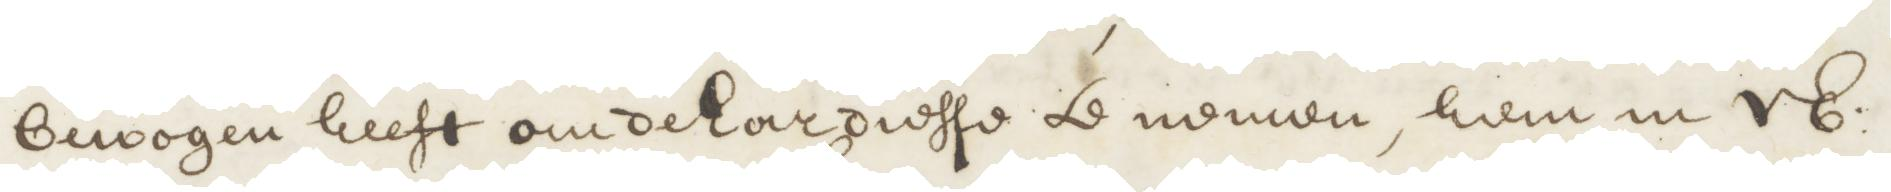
bewogen heeft om de hardiesse te nemen, hem in VE:
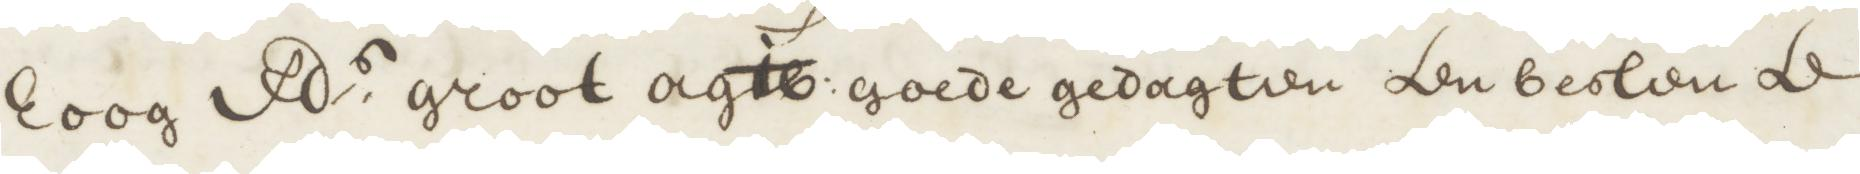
hoog Ed„s groot agtb:s goede gedagten ten besten te
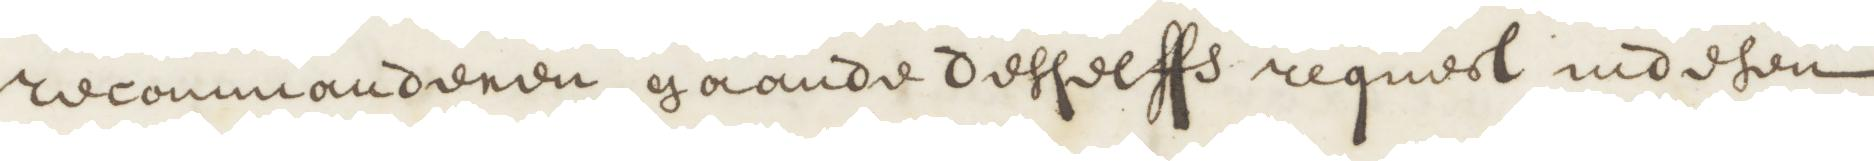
recommanderen, gaande desselffs request indesen
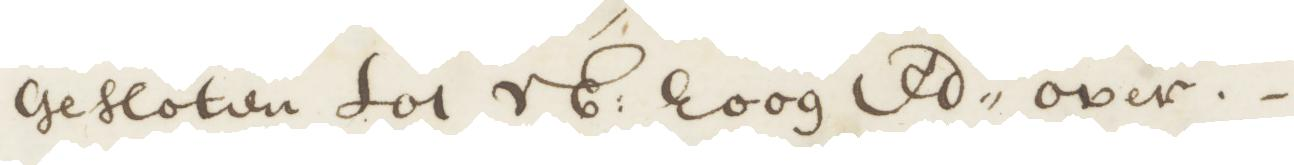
gesloten tot VE: hoog Ed„s over. -
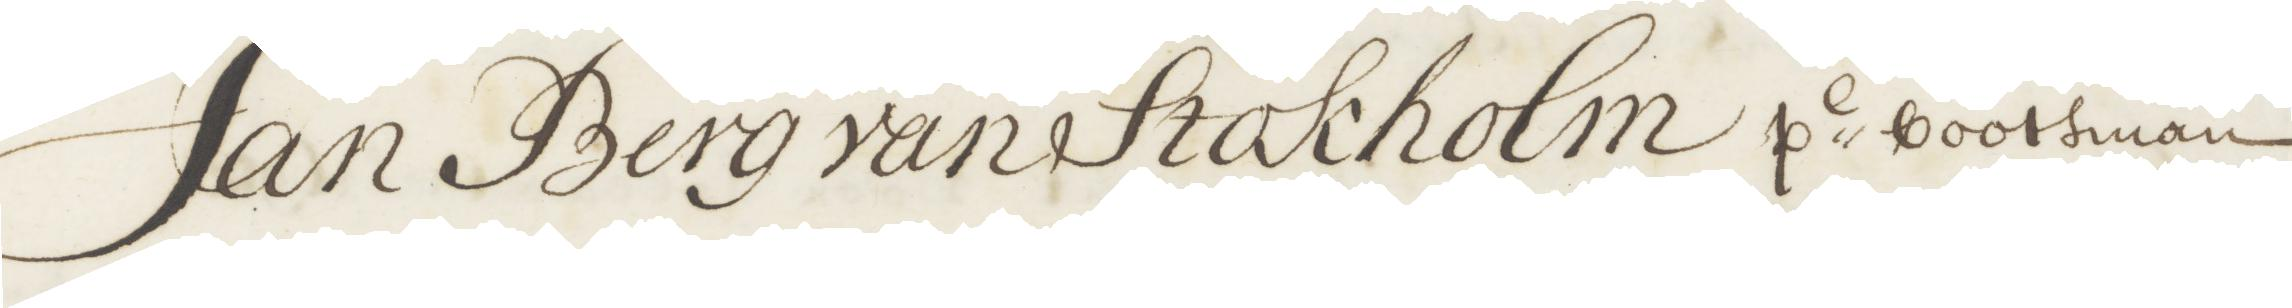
Jan Berg van Stokholm p„l bootsman
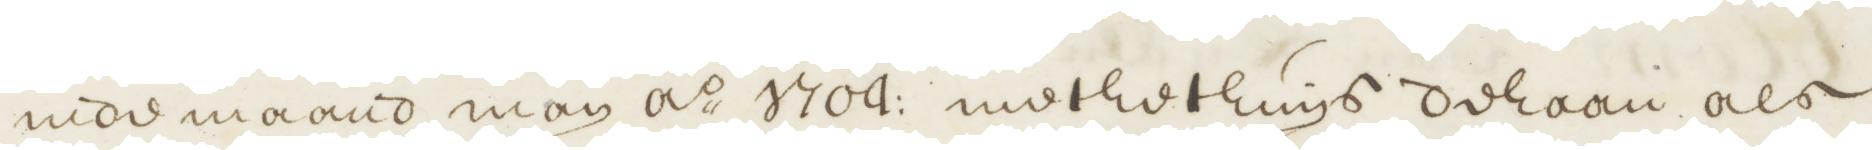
inde maand maij a„o 1704: met het huijs dehaan als
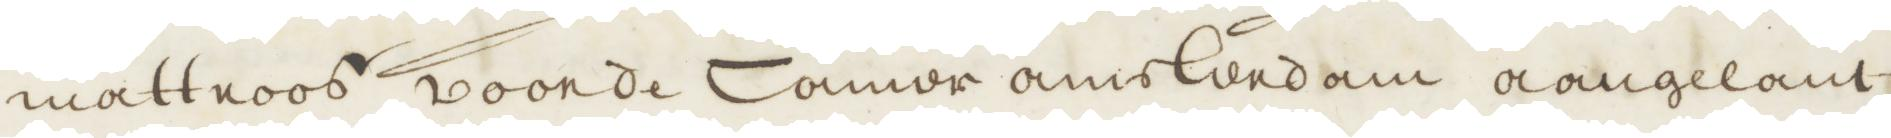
mattroos voor de Camer amsterdam aangelant
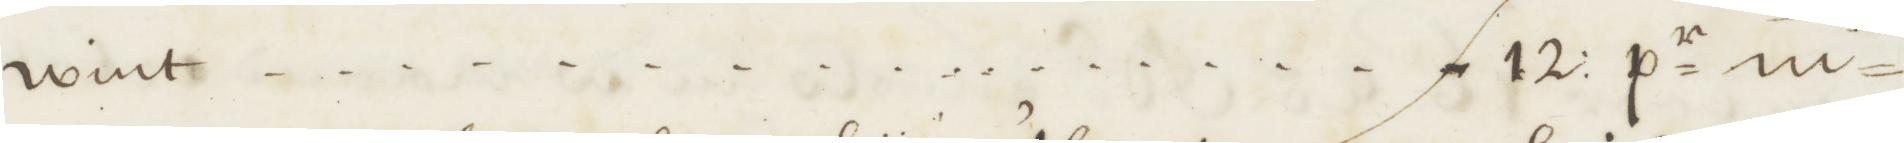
wint - - . - - - - - . , : - - - - - - ƒ 12: p=r m=t
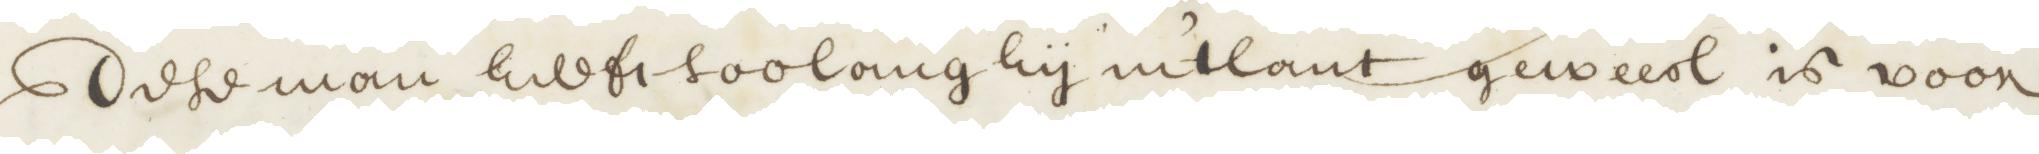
dese man heeft soolang hij in't lant geweest is voor
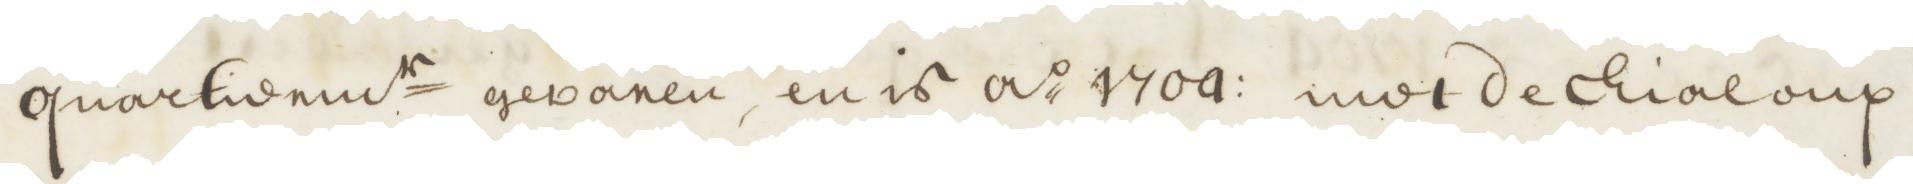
quartierm=r gevaren, en is a„o 1704: met de chialoup
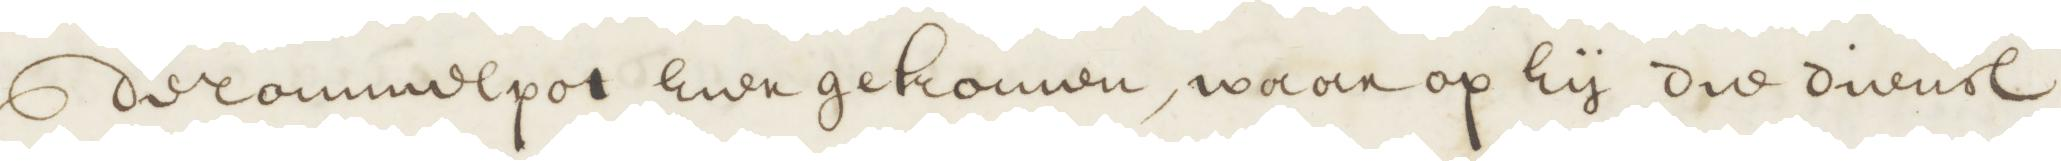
de rommelpot hier gekomen, waar op hij die dienst
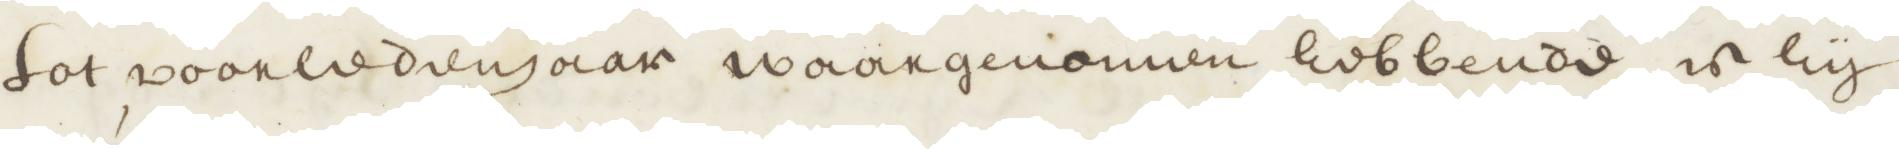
tot voorleden jaar waar genomen hebbende, is hij
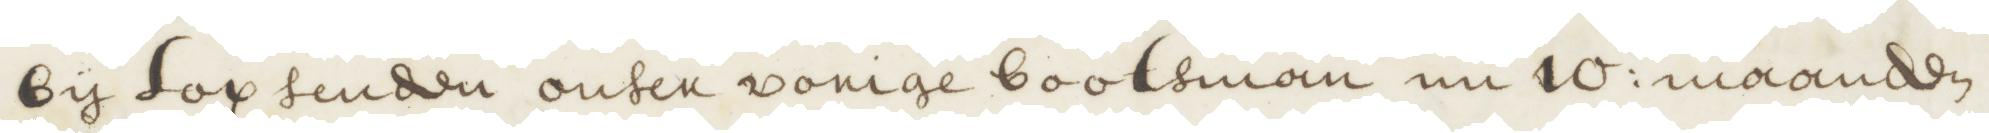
bij 't op senden onser vorige bootsman nu 10: maanden
